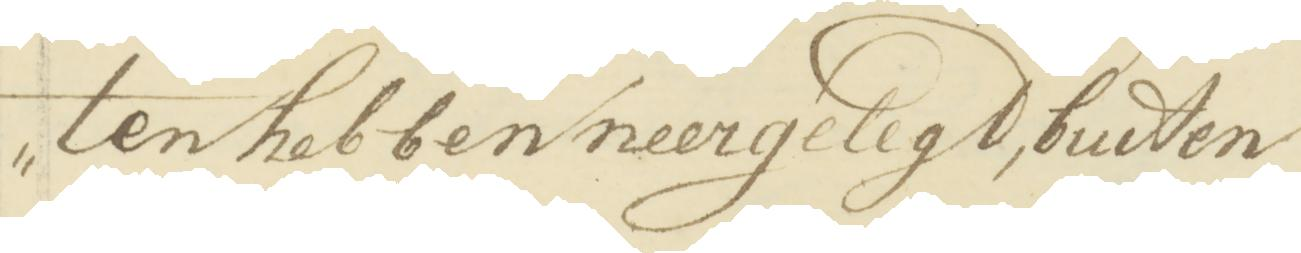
„ten hebben neergelegd, buiten
